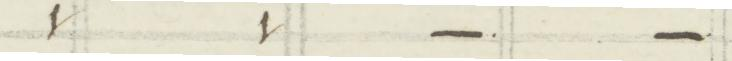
1 1 —. —.
